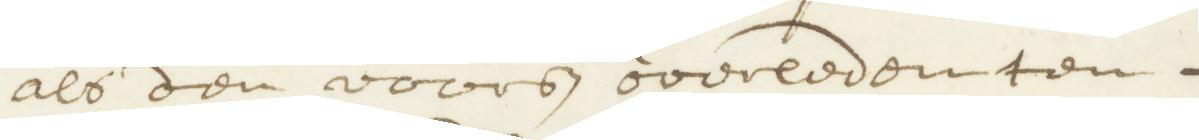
als den voors overleden ten
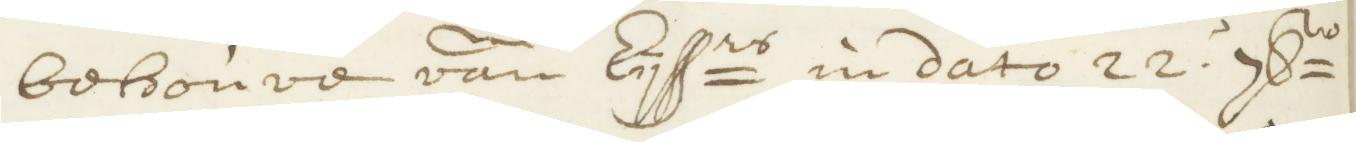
behouve van Eijss=rs in dato 22:' 7b=r
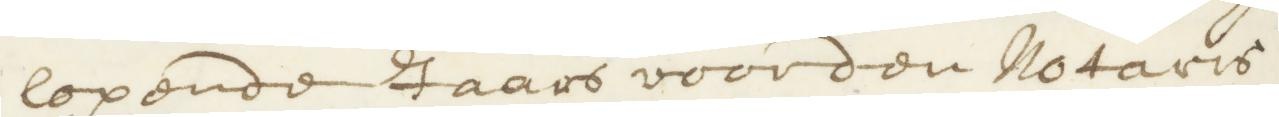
lopende Iaars voorden Notaris
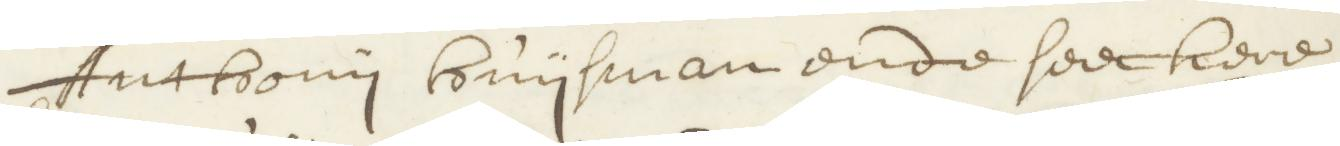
Anthonij huijsman ende seeckere
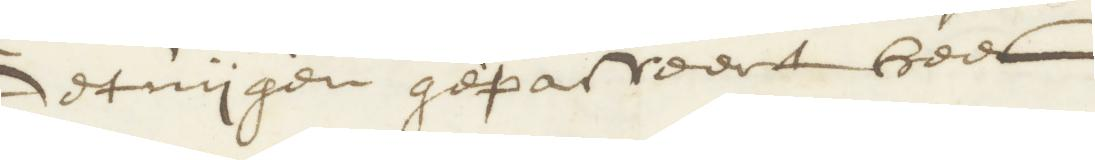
Getuijgen gepasseert heeft,
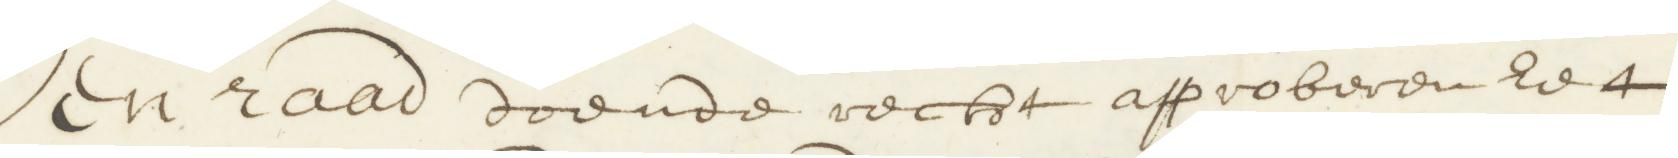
Den raad doende recht approberen het
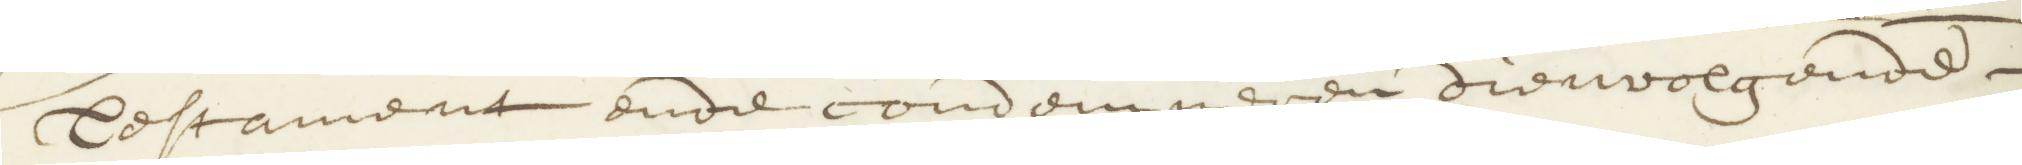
Testament ende condemneren dienvolgende —
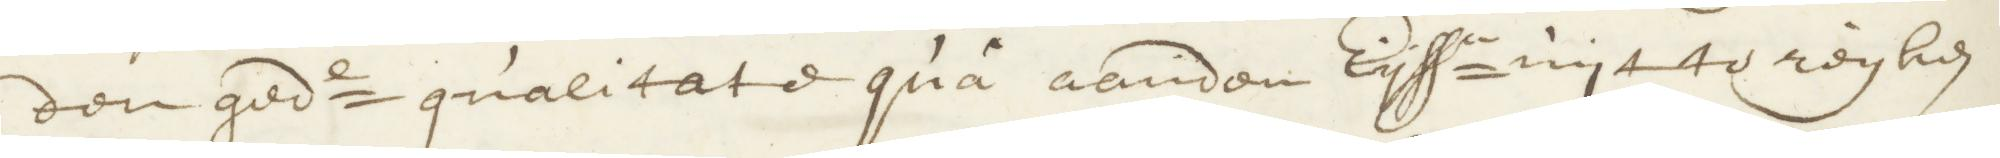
den ged=e qualitate qua aanden Eijss=r uijtte reijken
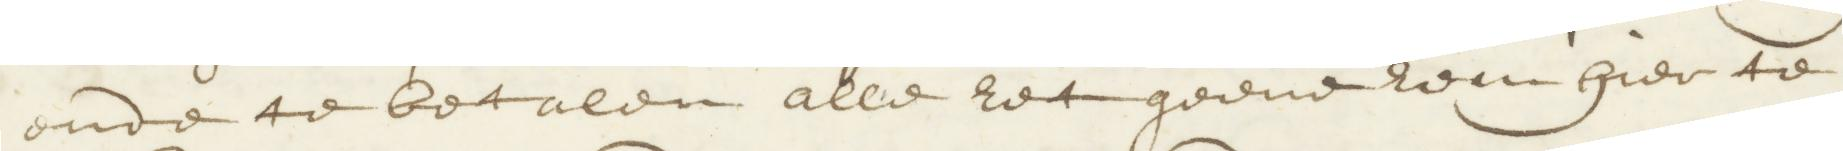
ende te betalen alle het geene hem hier te
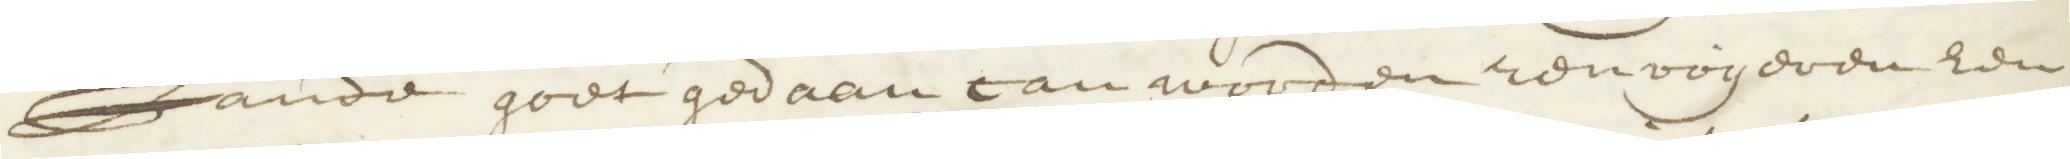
Lande goet gedaan can worden renvoijeren hen
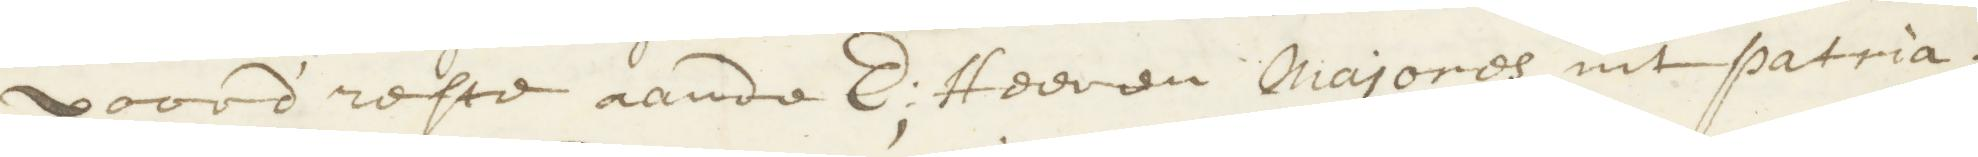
voord reste aande E: Heeren Majores int patria —
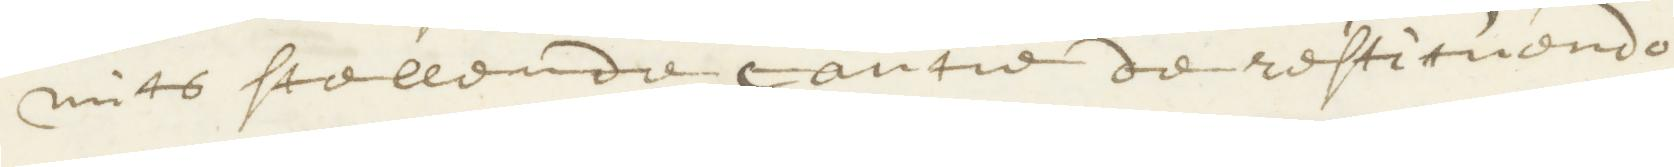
mits stellende cautie de restituendo
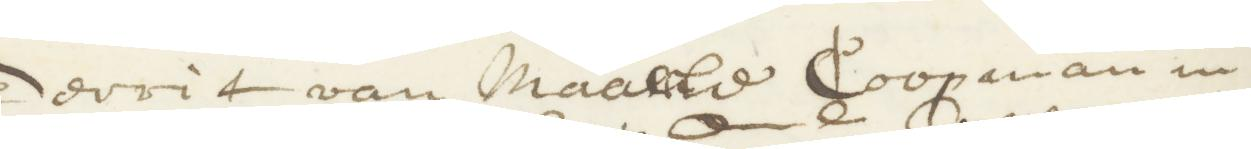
Gerrit van Maarle Coopman in
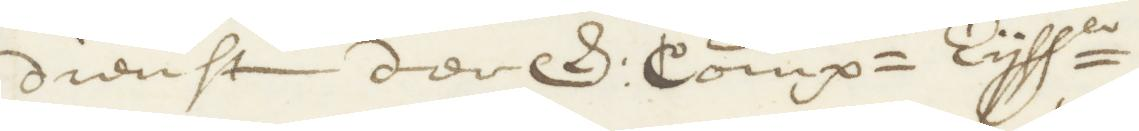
dienst der E: Comp=e Eijss=er
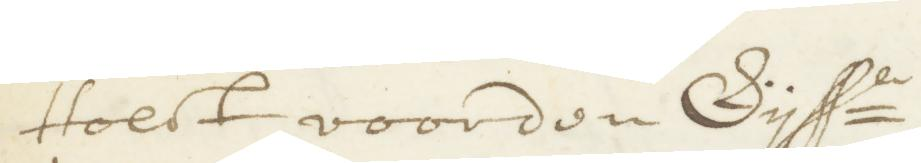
Holst voor den Eijss=er
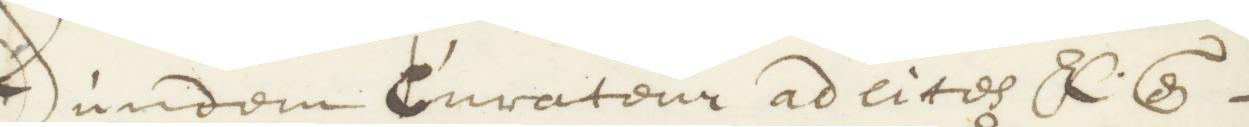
Eundem Curateur ad lites &: ende —
